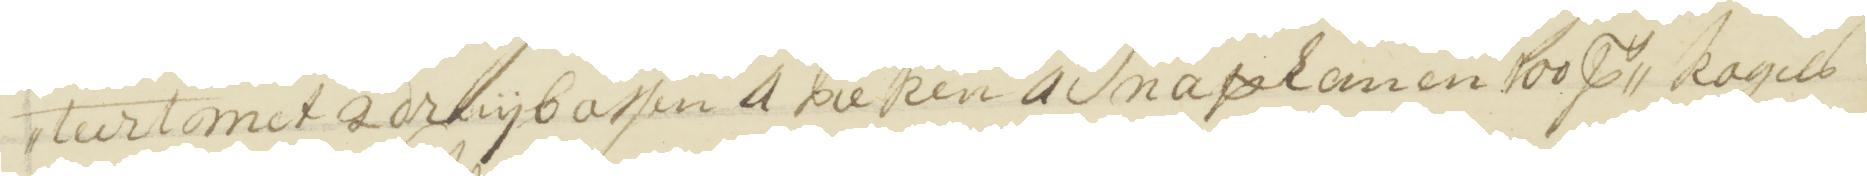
„teert met 2 draijbassen 4 pieken 4 snaphanen 100 p„s kogels
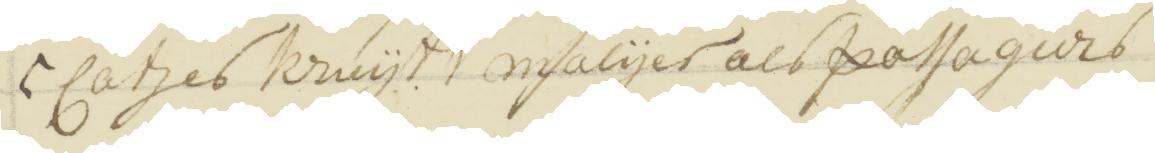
5 Catjes kruijt 1 malijer als passagiers
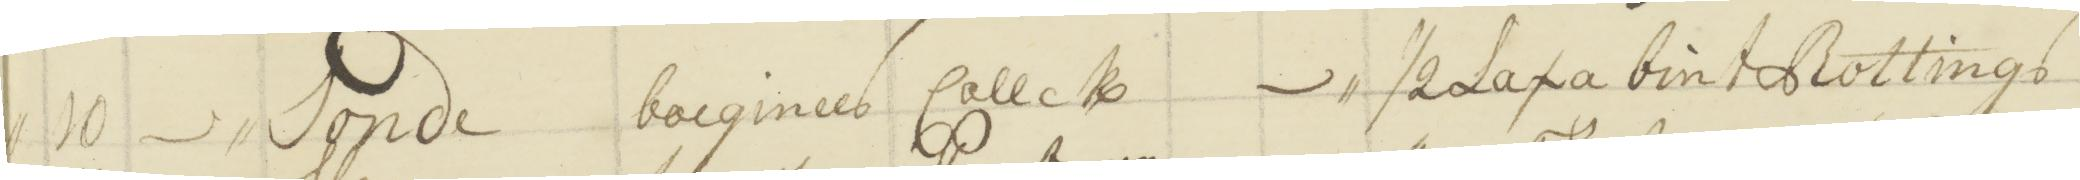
„ 10 _„ Sonde boeginees Callek _„ ½ Laxa bint Rottings
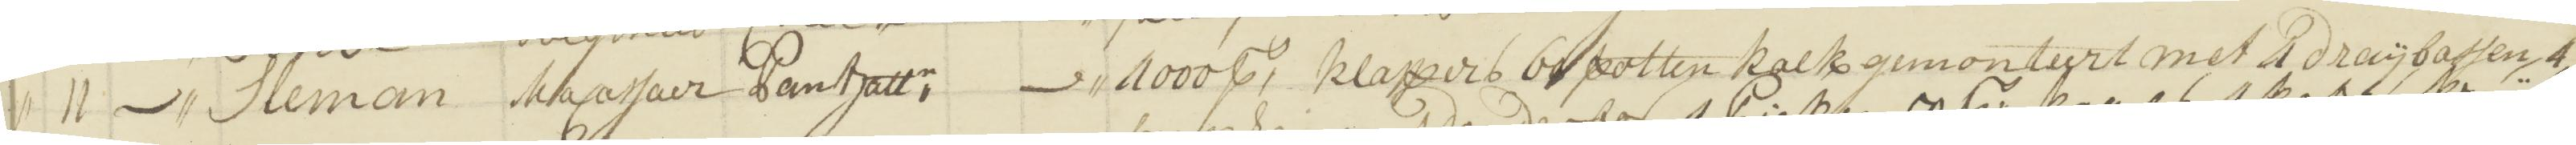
„ 11 _„ Sleman Macassaer Pantjall„n _„o 4000 p„s klappers 60 potten kalk gemonteert met 4 draijbassen, 4
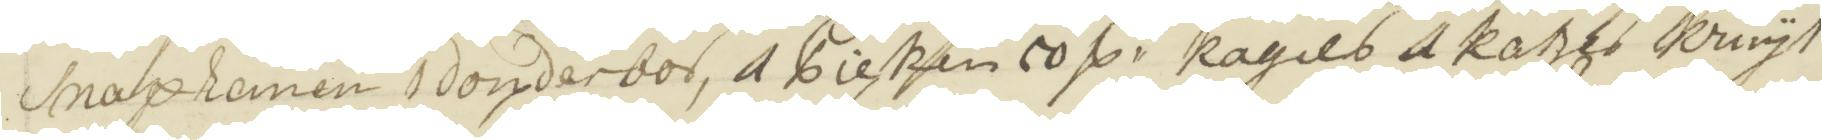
snaphanen 1 donderbos, 4 Pieken 50 p„s kogels 4 katjes kruijt
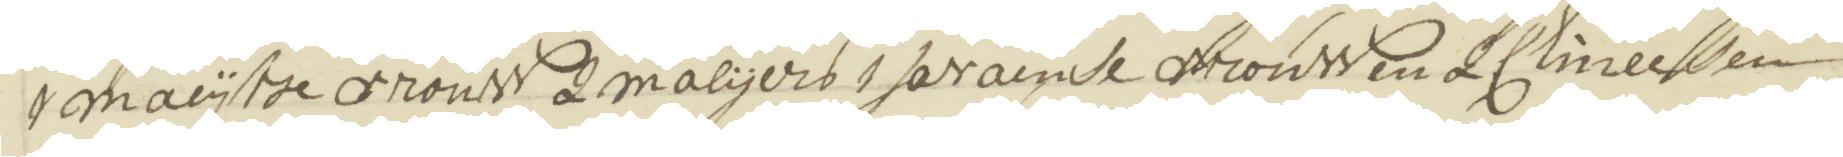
1 maleijtse vrouw 2 malijers 1 javaense vrouw en 2 Chineesen
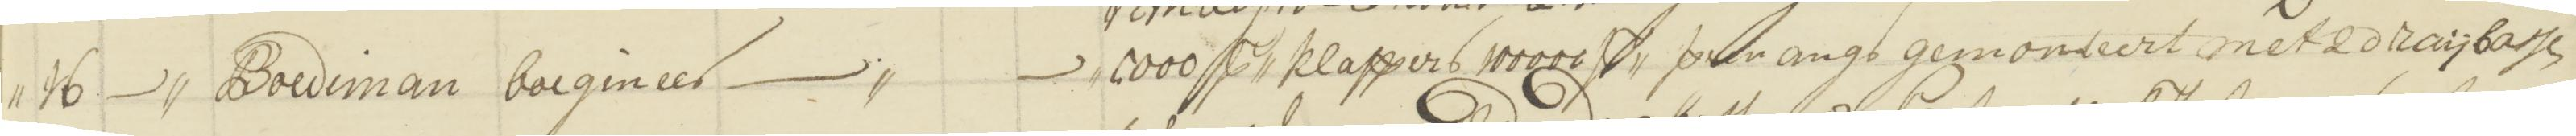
„ 16 _„ Boediman boeginees _„ _„ 5000 p„s klappers 100000 p„s pienangs gemonteert met 2 draijbassen
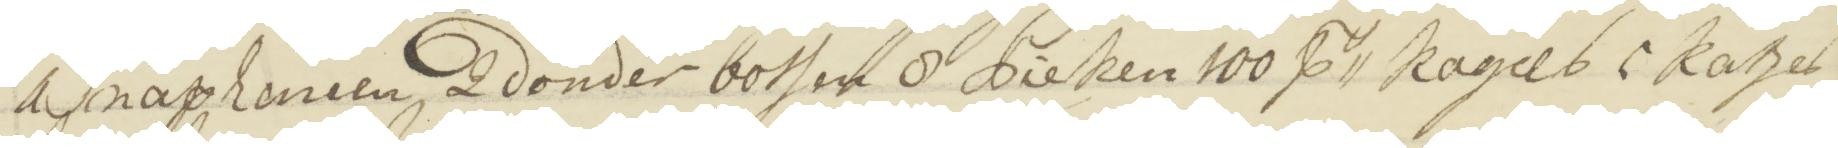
4 snaphanen, 2 donder bossen 8 Pieken 100 p„s kogels 5 katjes
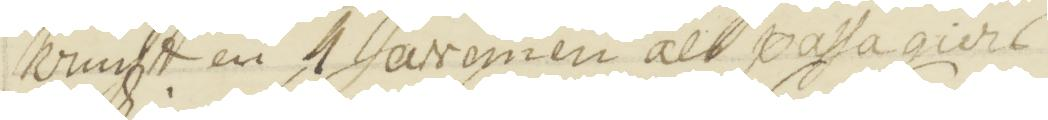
kruyt en 4 Javanen als passagiers
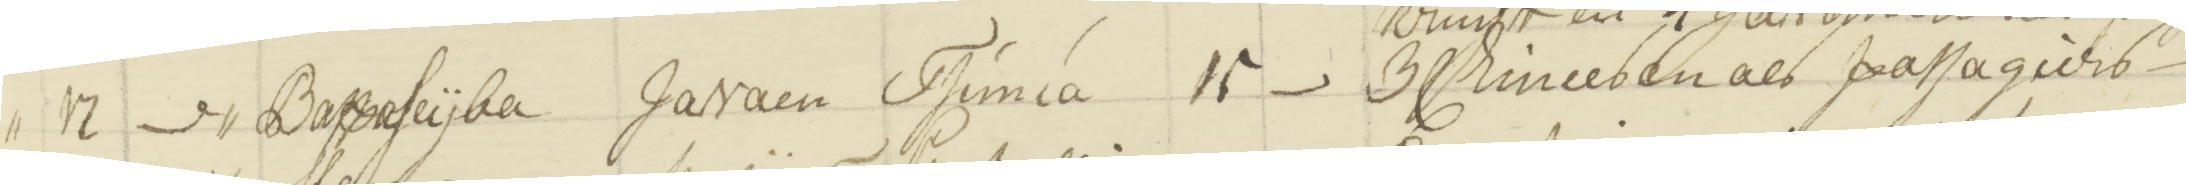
„ 17 _„ Bappaseijba Javaen Tjunia 15 _ 3 Chineesen als passagiers
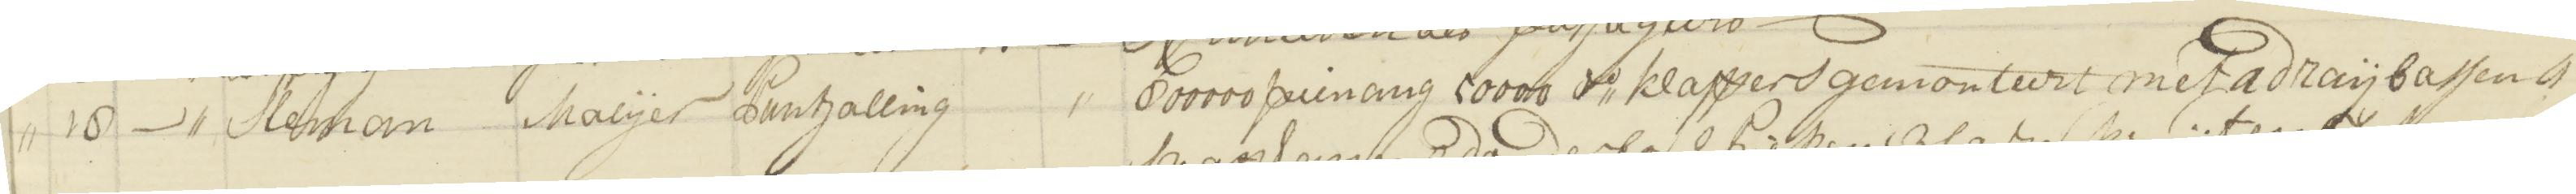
„ 18 _„ Sleman Malijer Pantjalling „ 800000 pienang 50000 d„o klappers gemonteert met 4 draij bassen 4
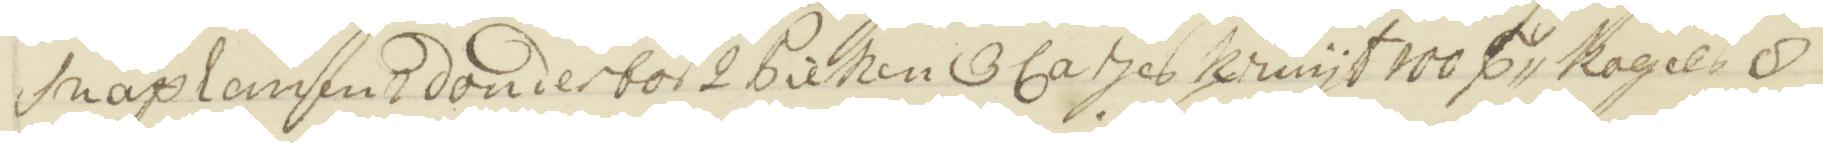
snaphanen 2 donderbos 2 Pieken 3 Catjes kruijt 100 p„s kogels 8
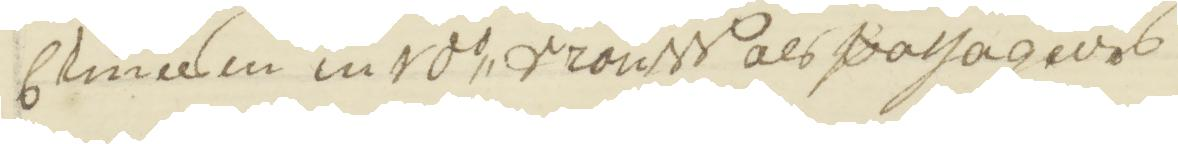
Chineesen en 1 d„o vrouw als passagiers
